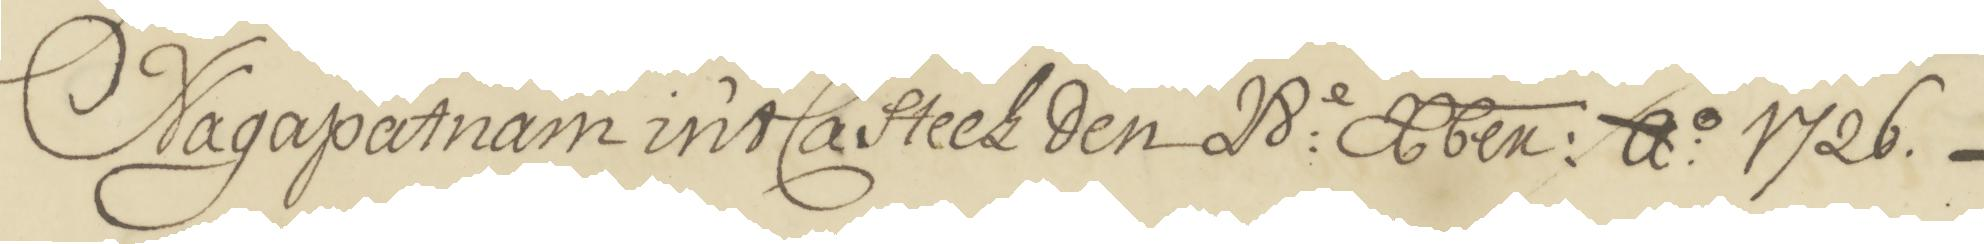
Nagapatnam in ’t Casteel den 28:e Xber: A:o 1726.—
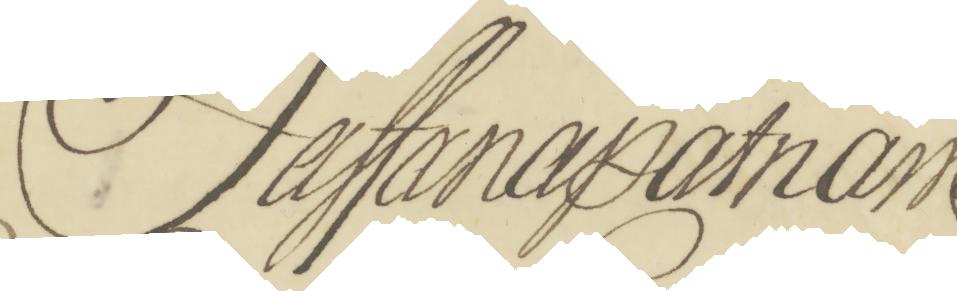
Iaffanapatnan
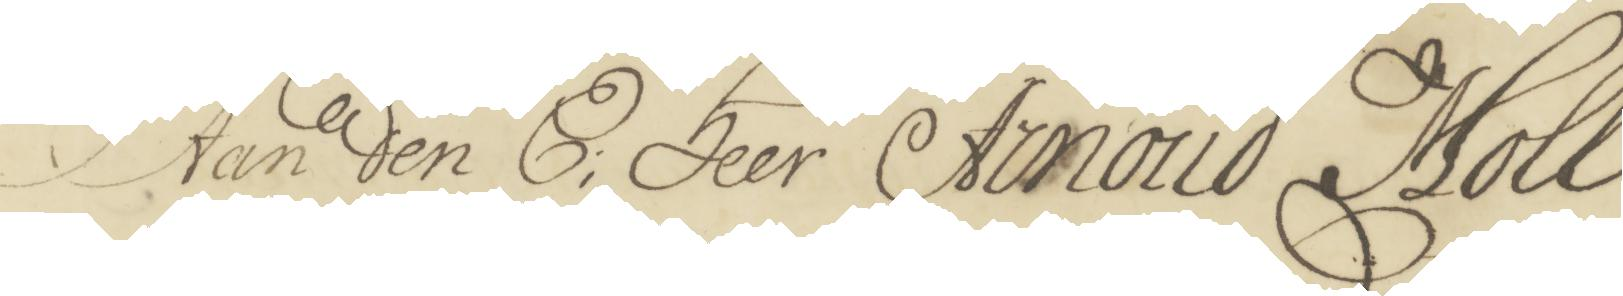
Aan den E: Heer Arnoud Moll
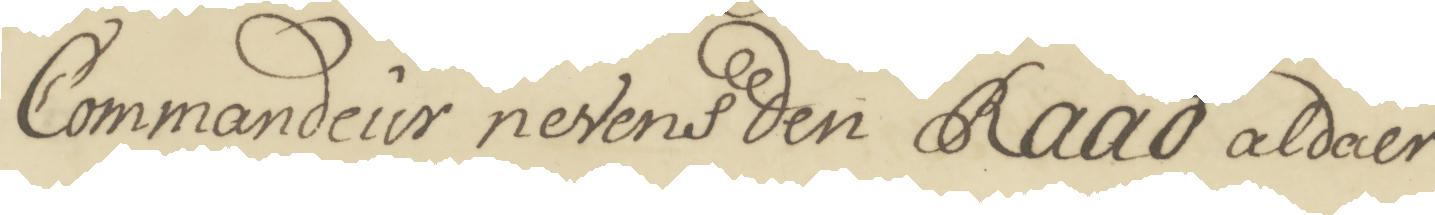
Commandeur nevens den Raad aldaer
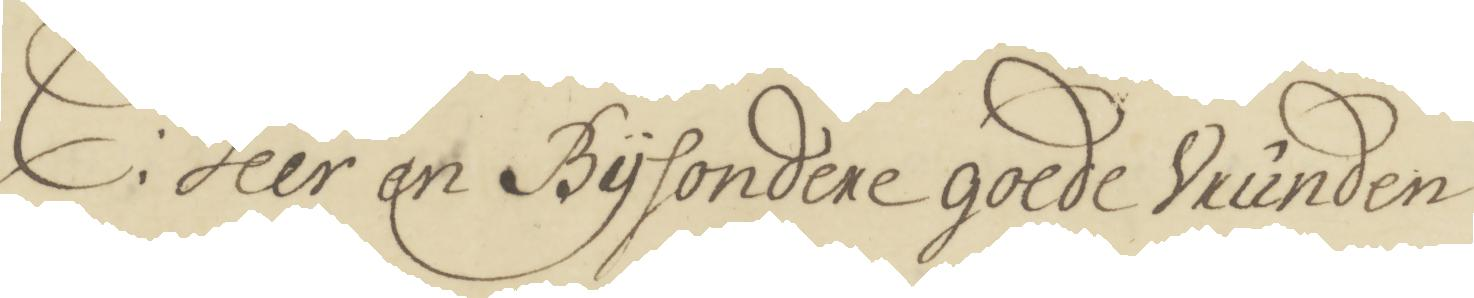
E: Heer en Bijsondere goede Vrunden
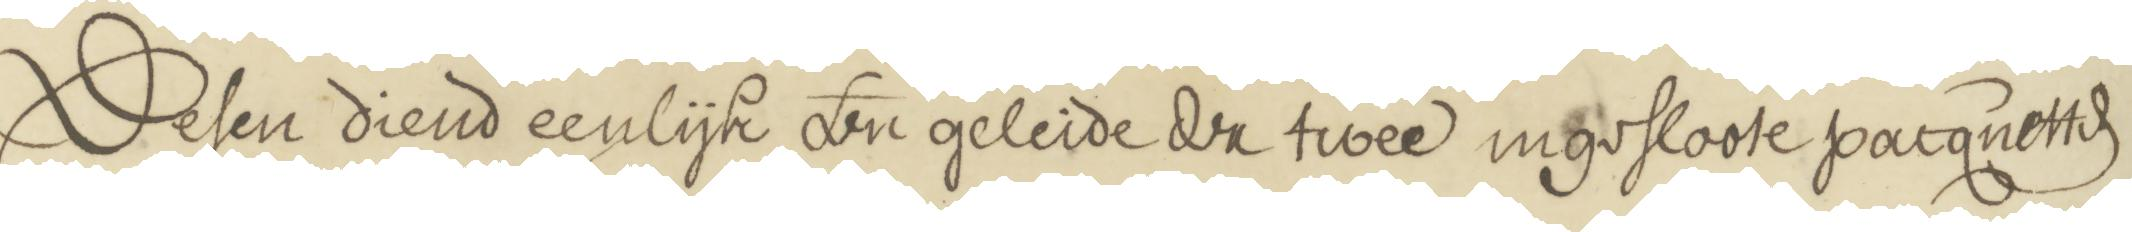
Desen diend eenlijk ten geleide der twee ingesloote pacquetten
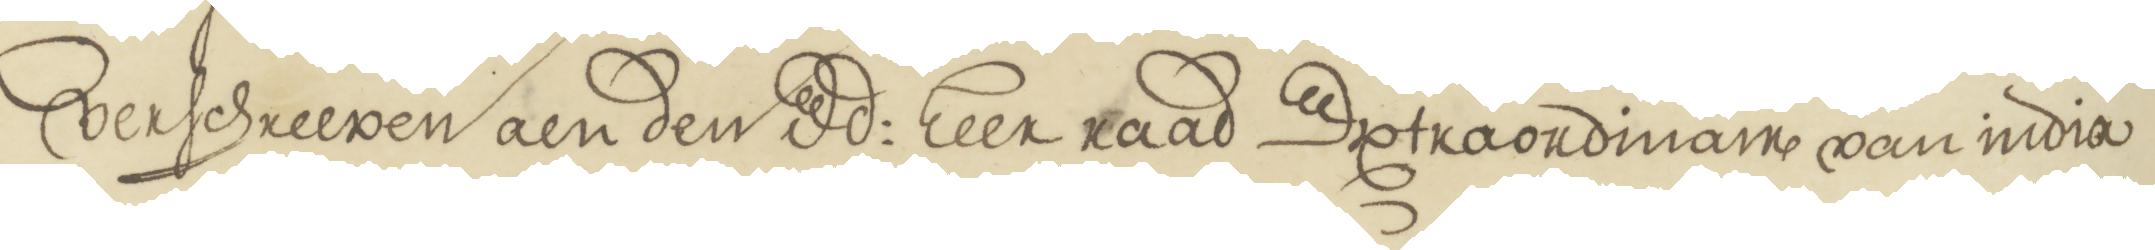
verschreeven aen den Ed: heer raad Extraordinair van india
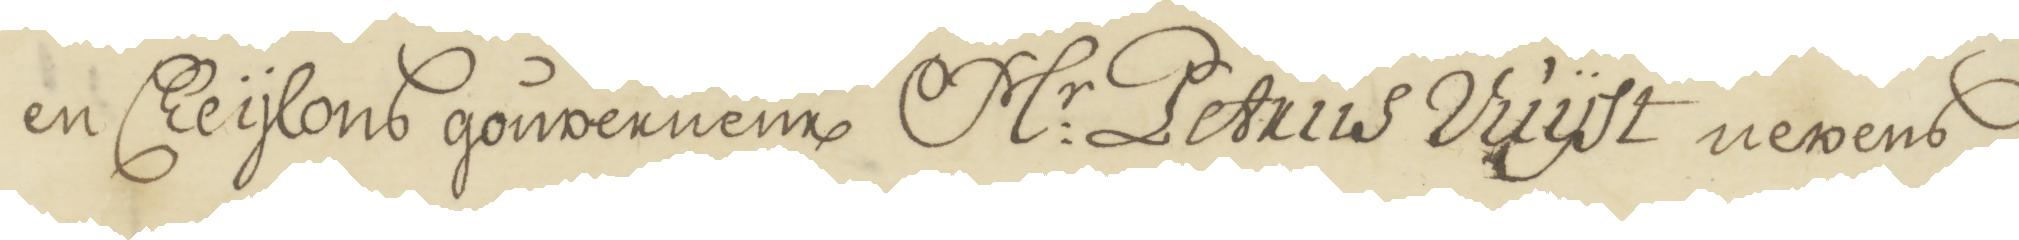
en Cheijlons gouverneur M:r Petrus Vuijst nevens
